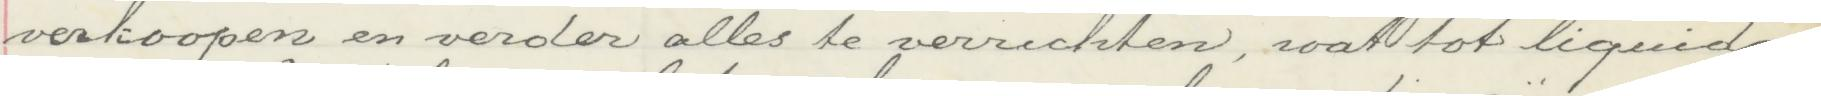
verkoopen en verder alles te verrichten, wat tot liquida-
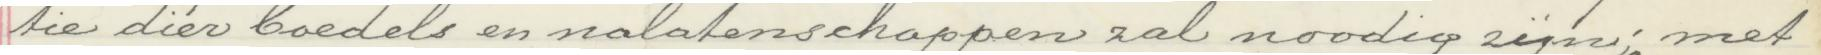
tie dier boedels en nalatenschappen zal noodig zijn met
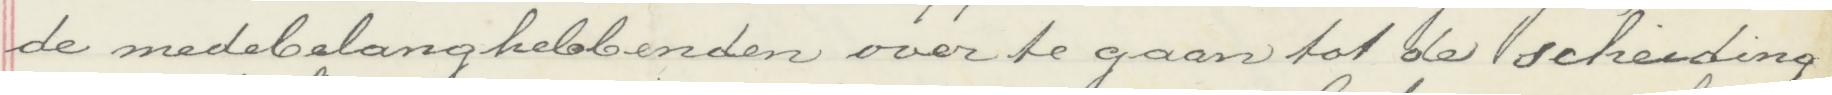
de medebelanghebbenden over te gaan tot de scheiding
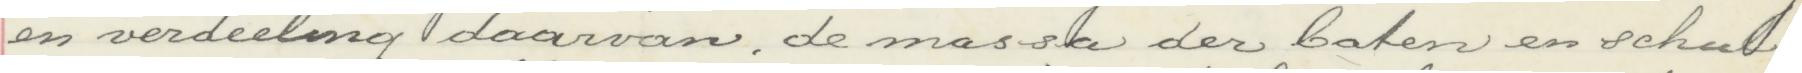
en verdeeling daarvan, de massa der baten en schul
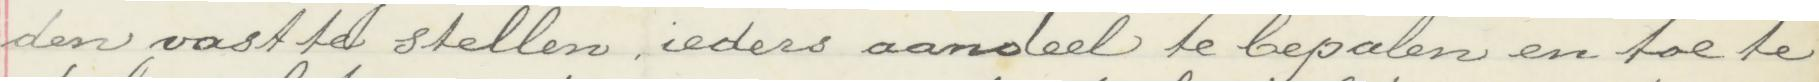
den vast te stellen, ieders aandeel te bepalen en toe te
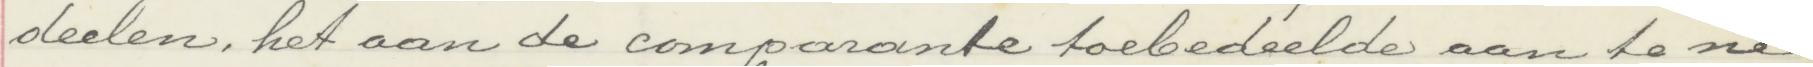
deelen, het aan de comparante toebedeelde aan te ne
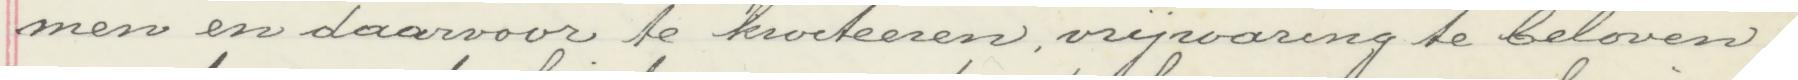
men en daarvoor te kwiteeren, vrijwaring te beloven;
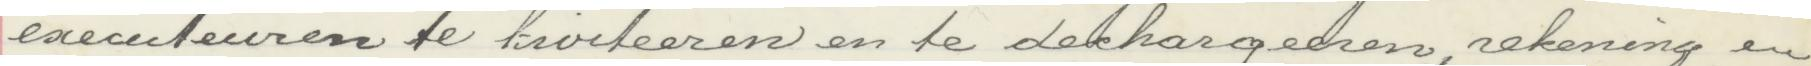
executeuren te kwiteeren en te dechargeeren rekening en
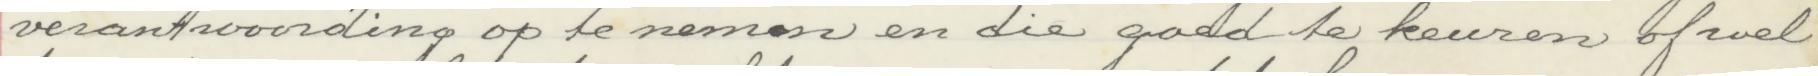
verantwoording op te nemen en die goed te keuren of wel
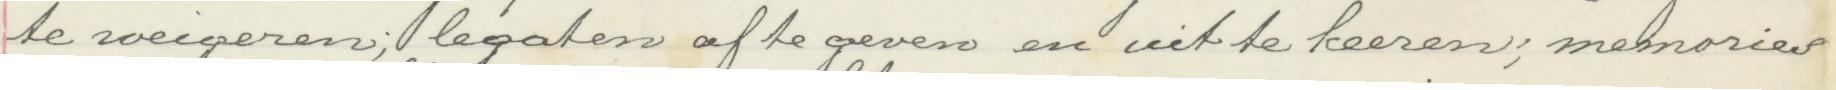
te weigeren; legaten af te geven en uit te keeren; memories
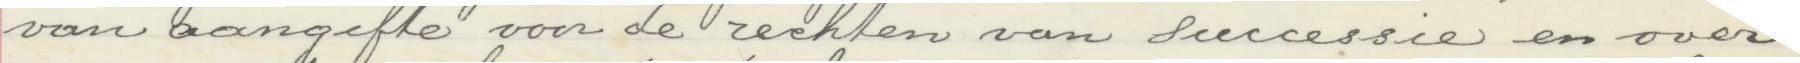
van aangifte voor de rechten van successie en over
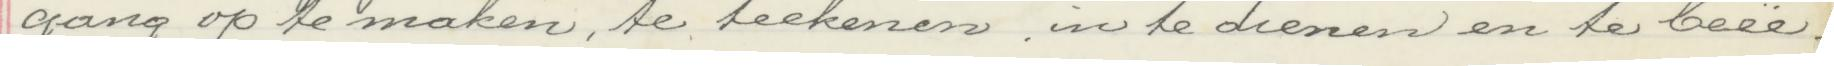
gang op te maken, te teekenen, in te dienen en te beëe-
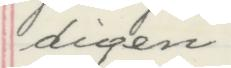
digen
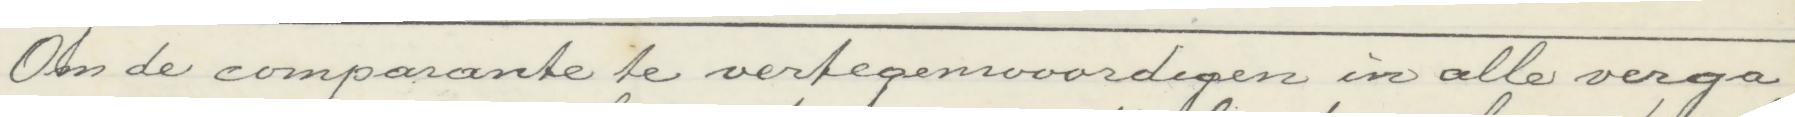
Om de comparante te vertegenwoordigen in alle verga
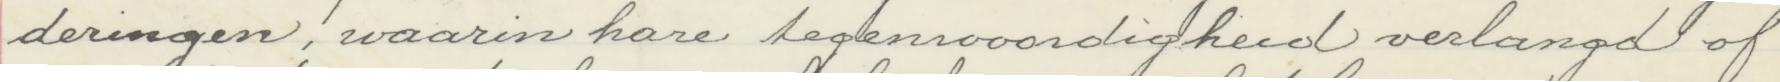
deringen, waarin hare tegenwoordigheid verlangd of
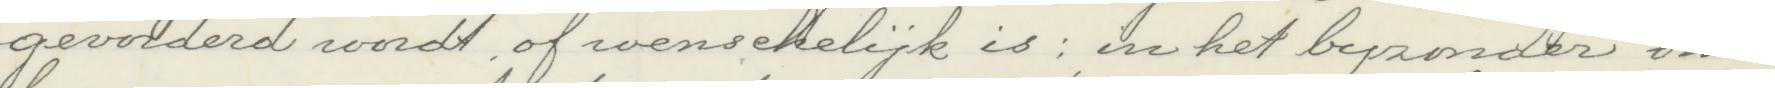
gevorderd wordt, of wenschelijk is; in het byzonder om
